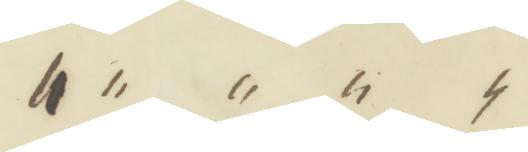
4 „ „ „ „
